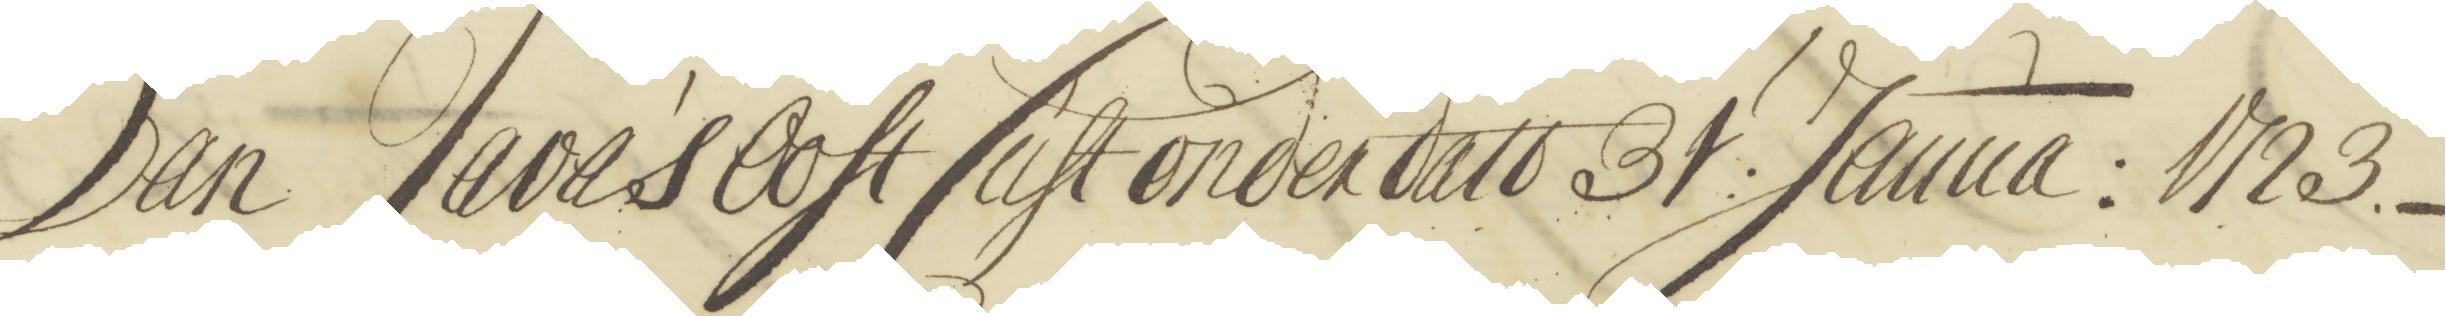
Van Java's Oost Cust onder dato 31: Janua: 1723. —
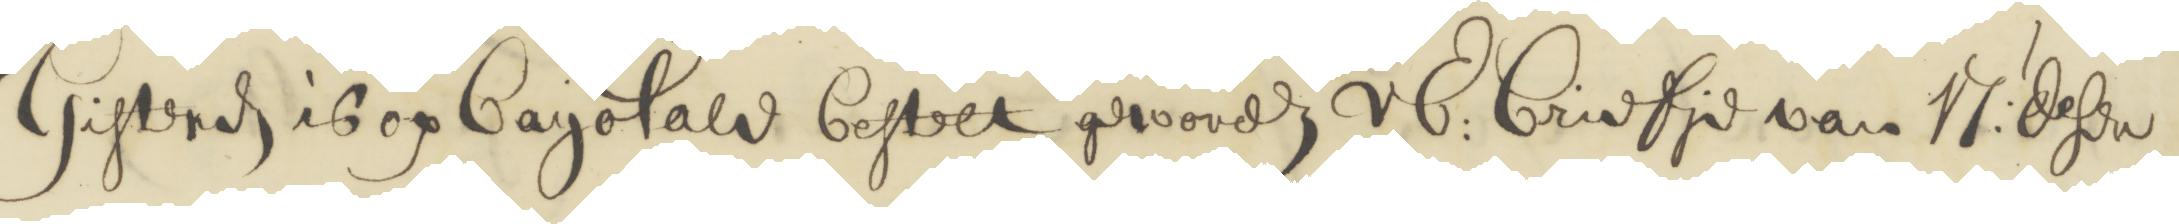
Gisteren is op baijolale bestelt geworden vE: briefje van 17:' deser
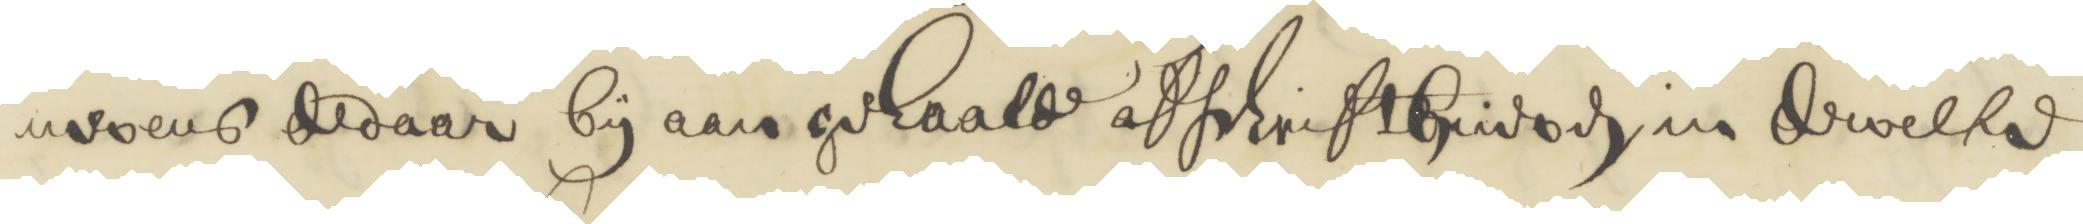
nevens de daar bij aangehaalde afschrift brieven in dewelke
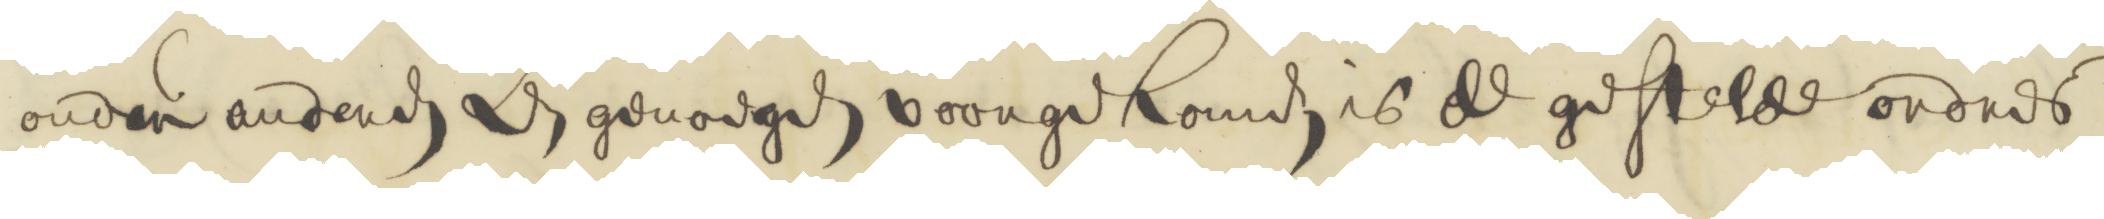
onder anderen ten genoegen voorgekomen is de gestelde ordres
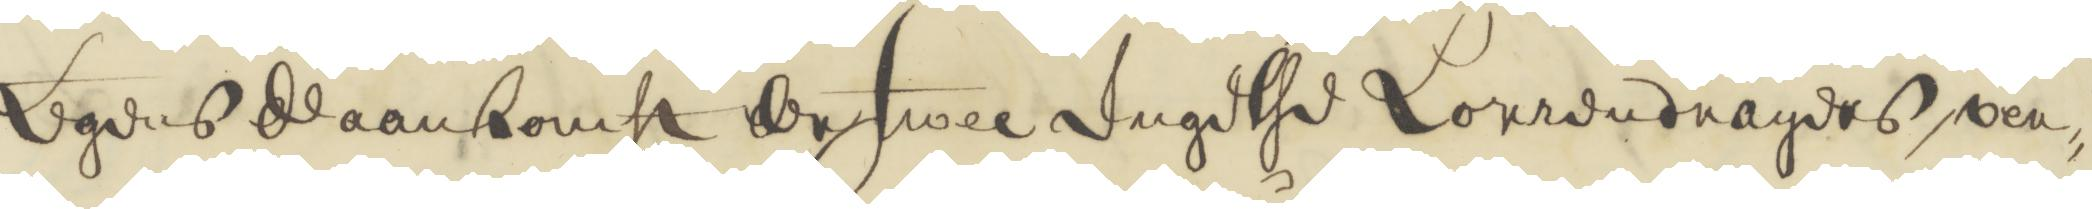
Tegens de aankomst der twee Engelse Lorrendraijers, ver„
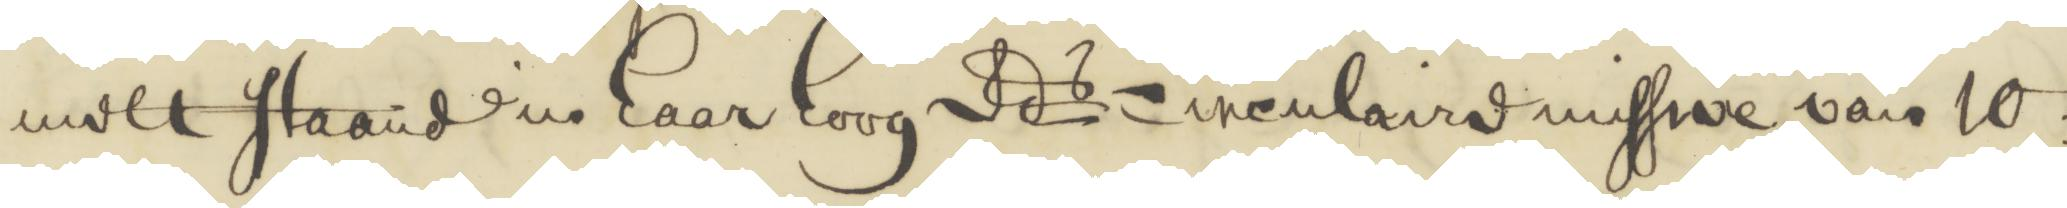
melt Staande in haar hoog Ed=s circulaire missive van 10:
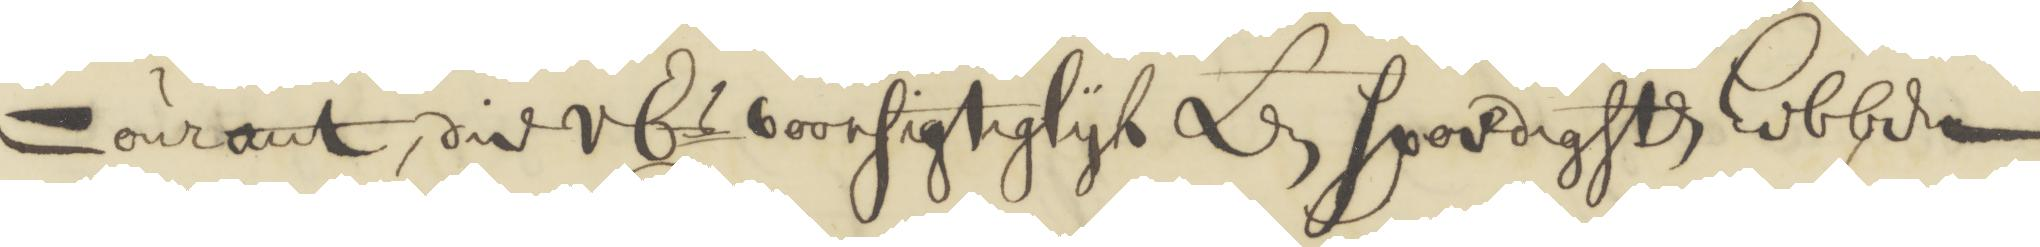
Courant, die vE=s voorsigtiglijk Ten Spoedigsten hebben
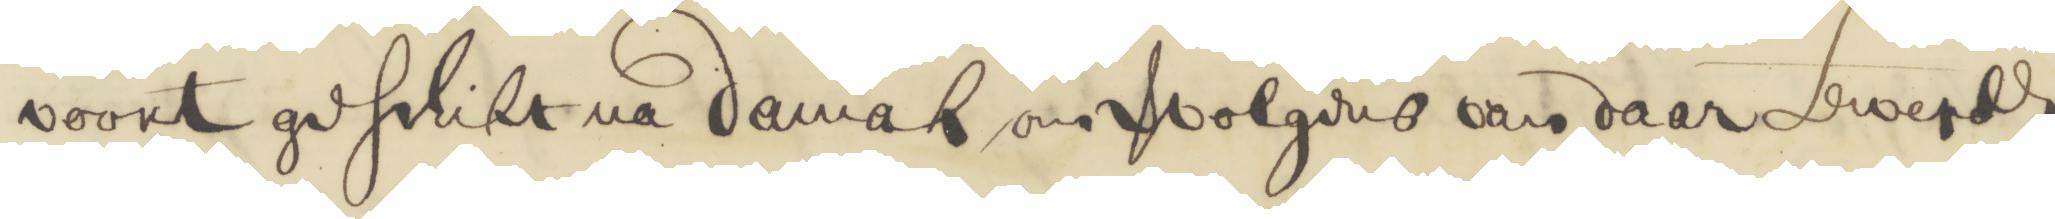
voort geschikt na damak, om vervolgens van daar te werden
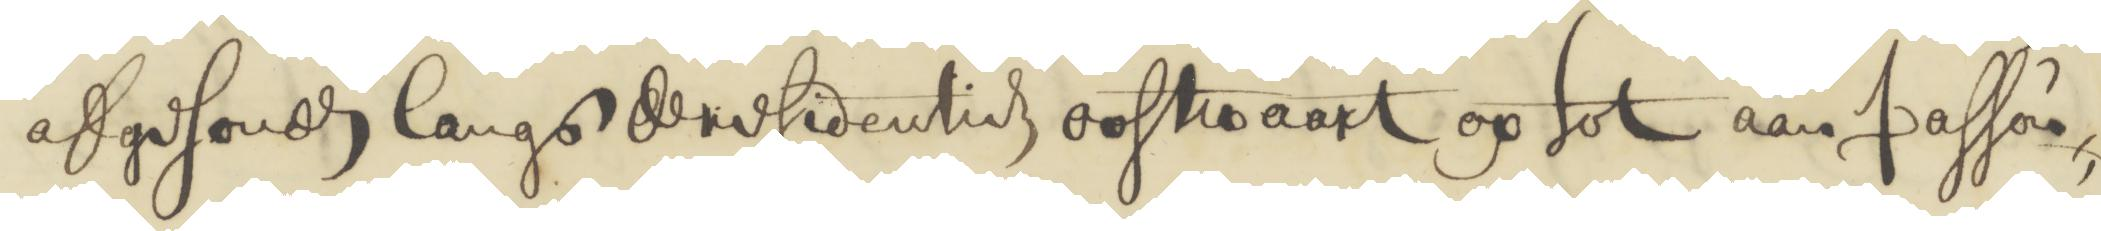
afgesonden langs de residentien oostwaart op Tot aan passou„
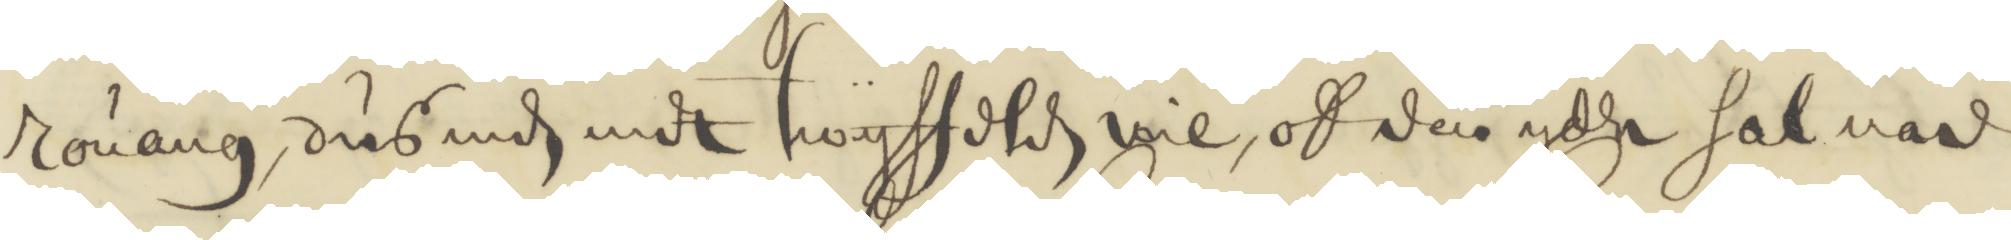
rouang, dus men niet twijffelen wil, of een ijder Sal nae
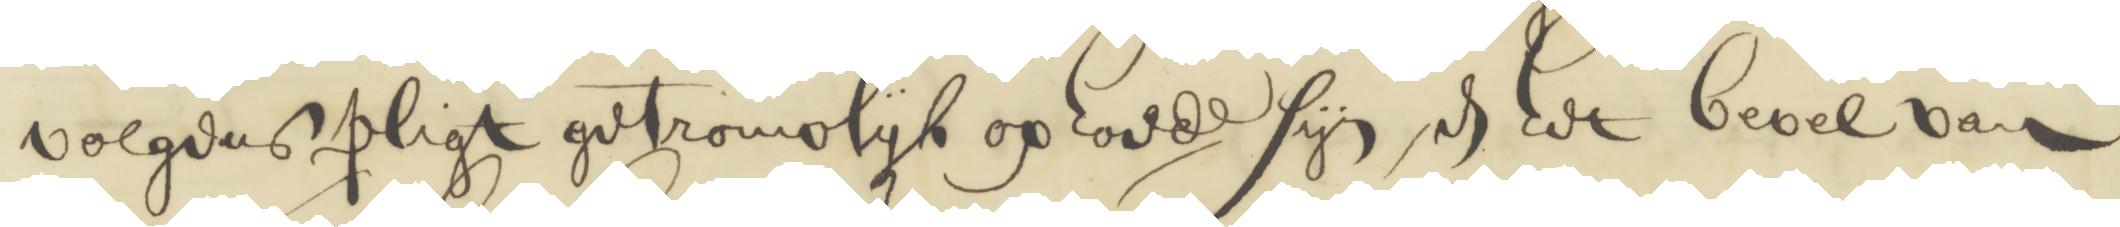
volgens pligt getrouwlijk op hoede Sijn, en het bevel van
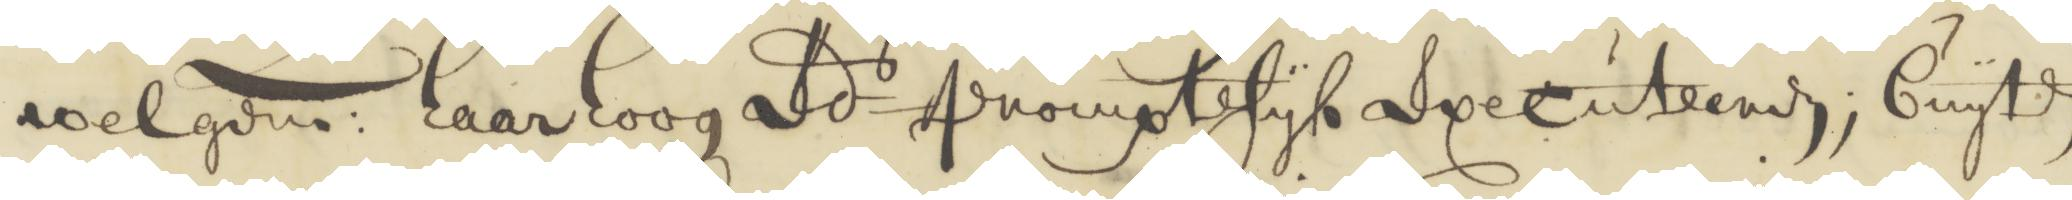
welgem: haar hoog Ed=s promptelijk Executeeren; buijten
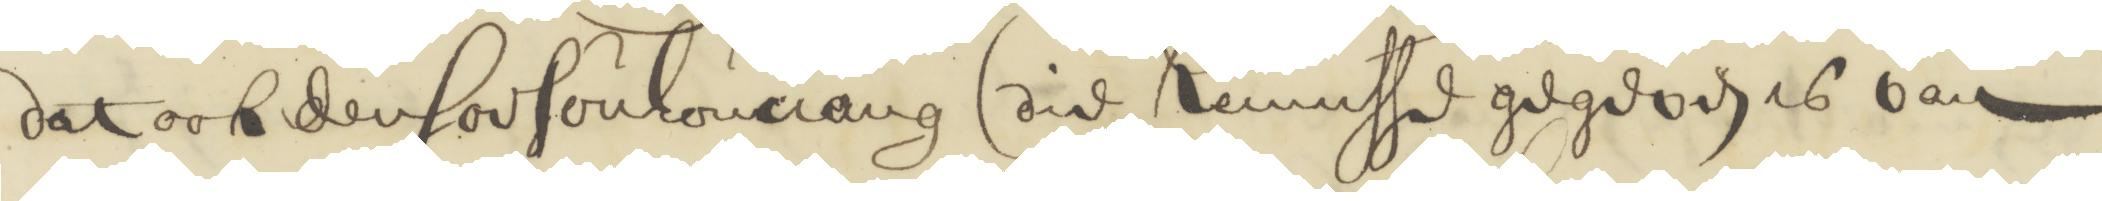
dat ook den Soesouhounang (die Kennisse gegeven is van
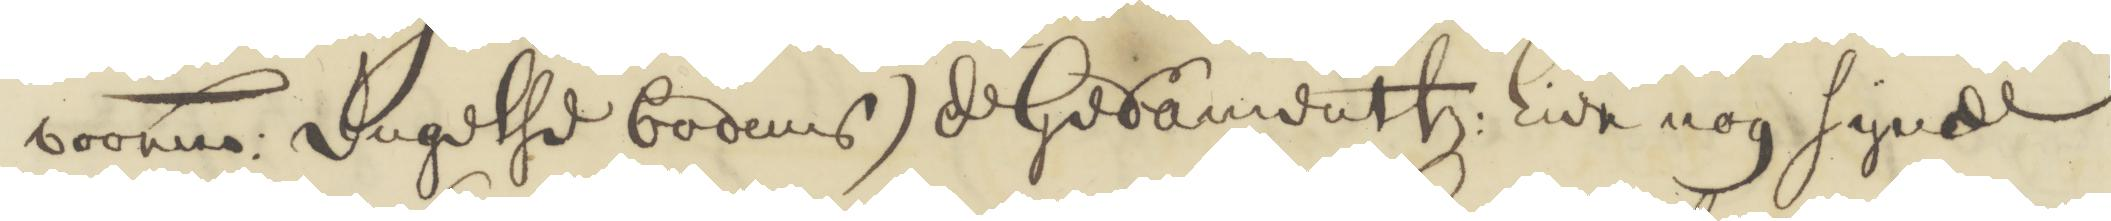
voorm: Engelse bodems) de Gesamentlijke hier nog Sijnde
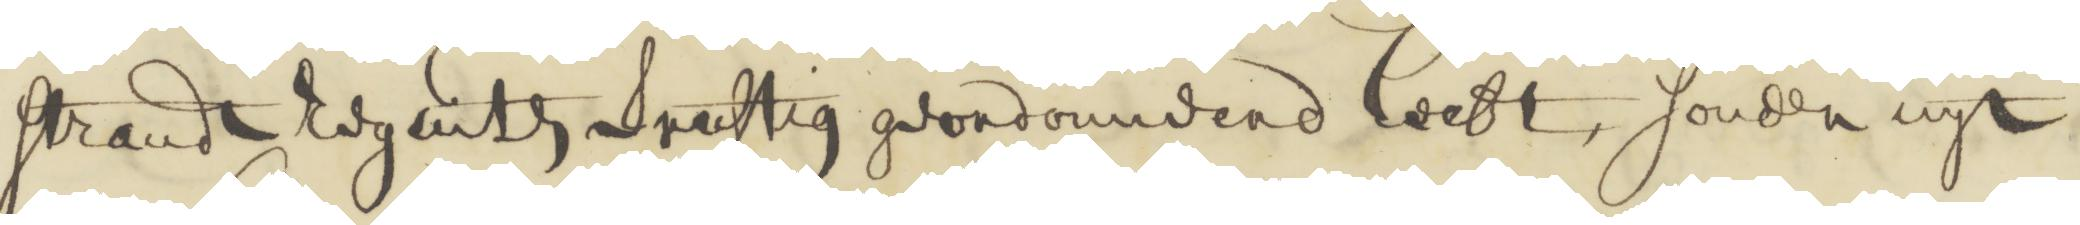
Strandt Regenten verrustig geordonneerd heeft, Sonder uijt
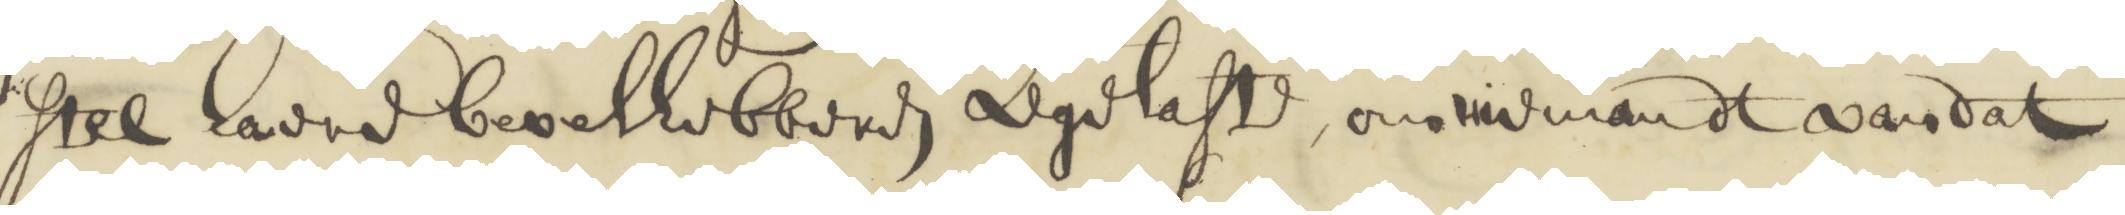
Stel haere bevelhebberen Te gelaste, om niemandt van dat
